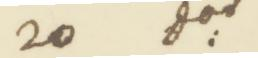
20 d:os
